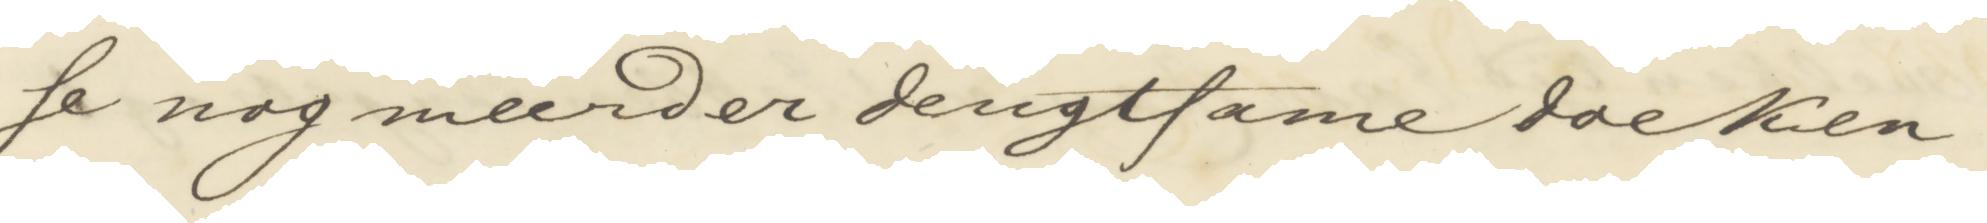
se nog meerder deugtsame doeken
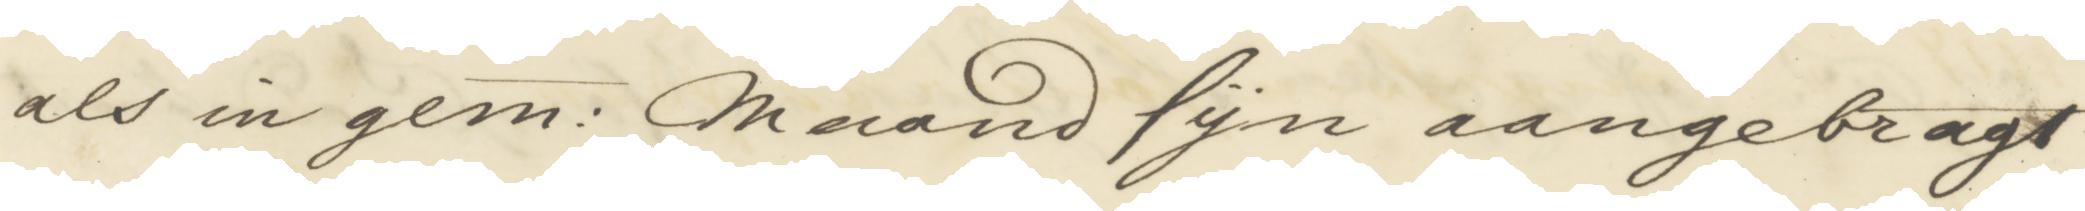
als in gem: maand sijn aangebragt
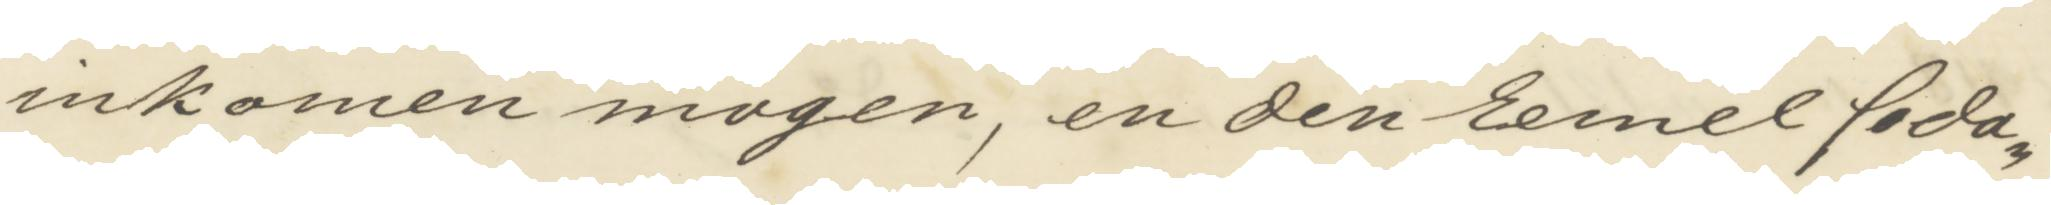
inkomen mogen, en den hemel soda„
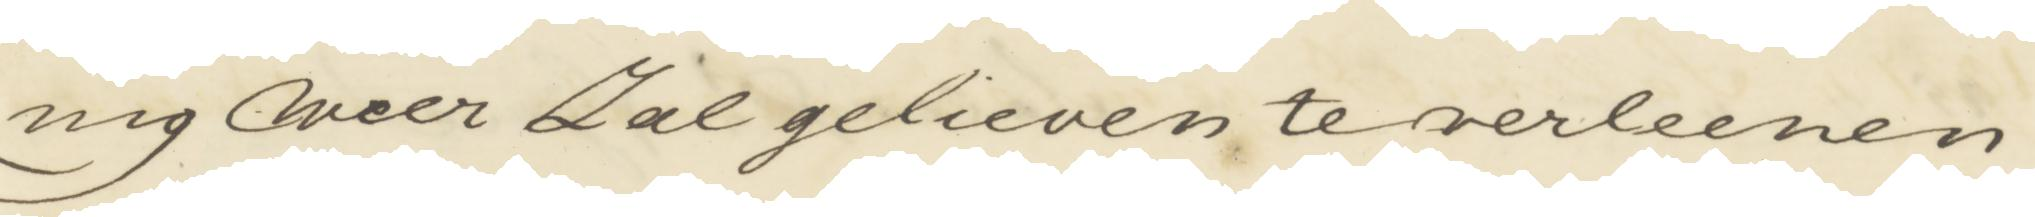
nig weer zal gelieven te verleenen
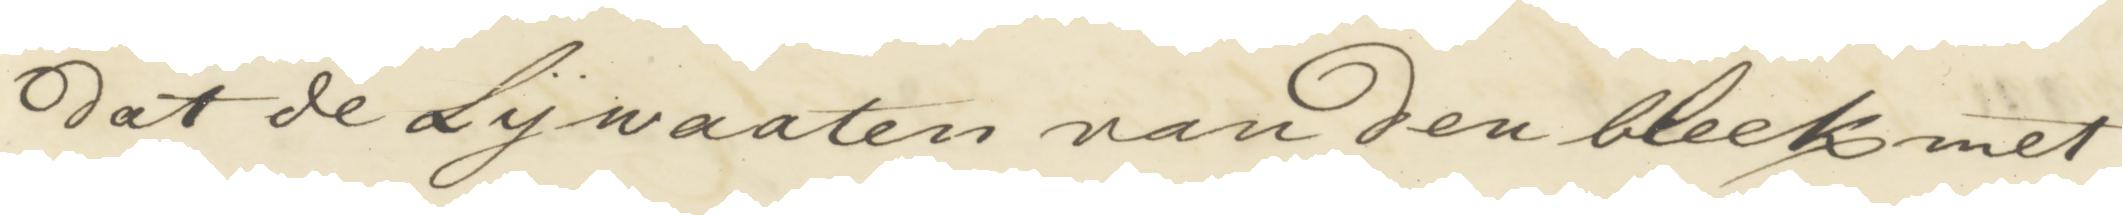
dat de Lijwaaten van den bleek met
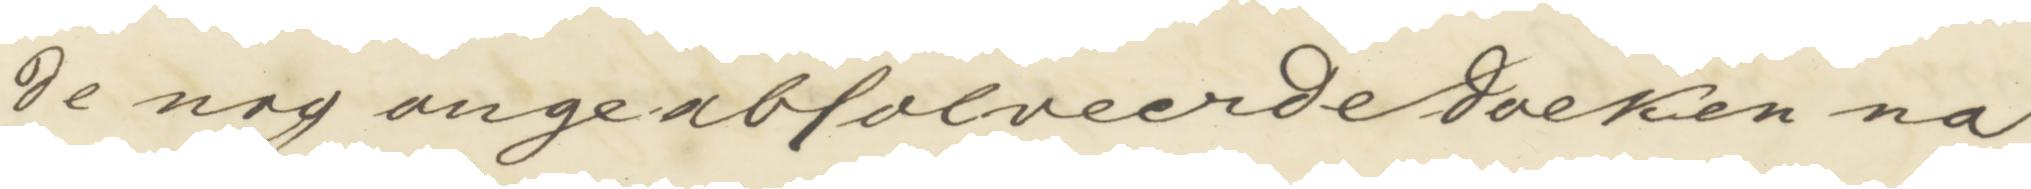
de nog ongeabsolveerde doeken na
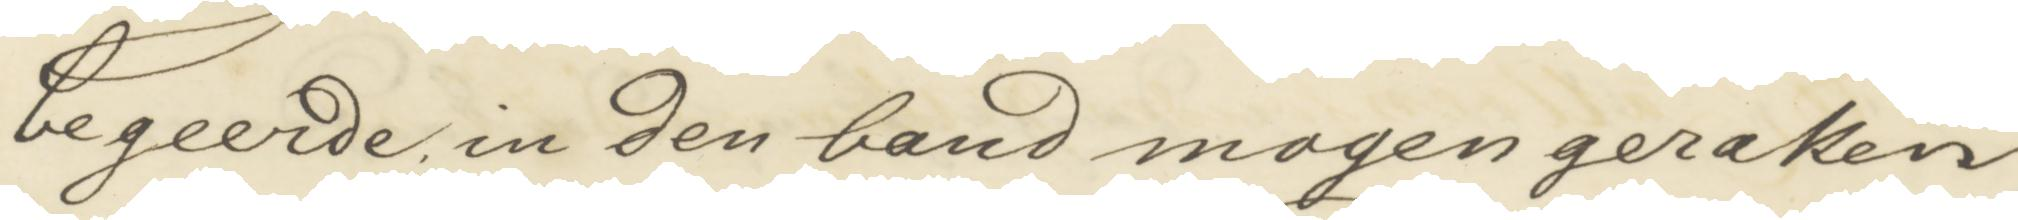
begeerde in den band mogen geraken
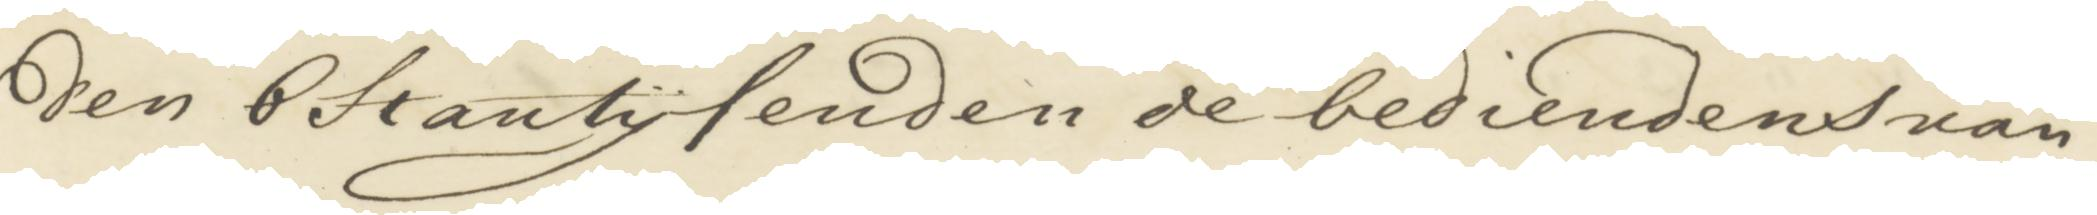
den 6 stantij senden de bediendens van
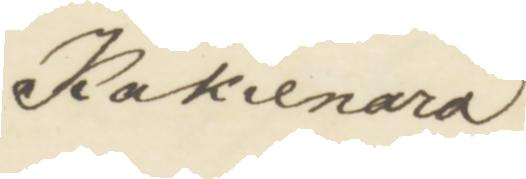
Kakienara
